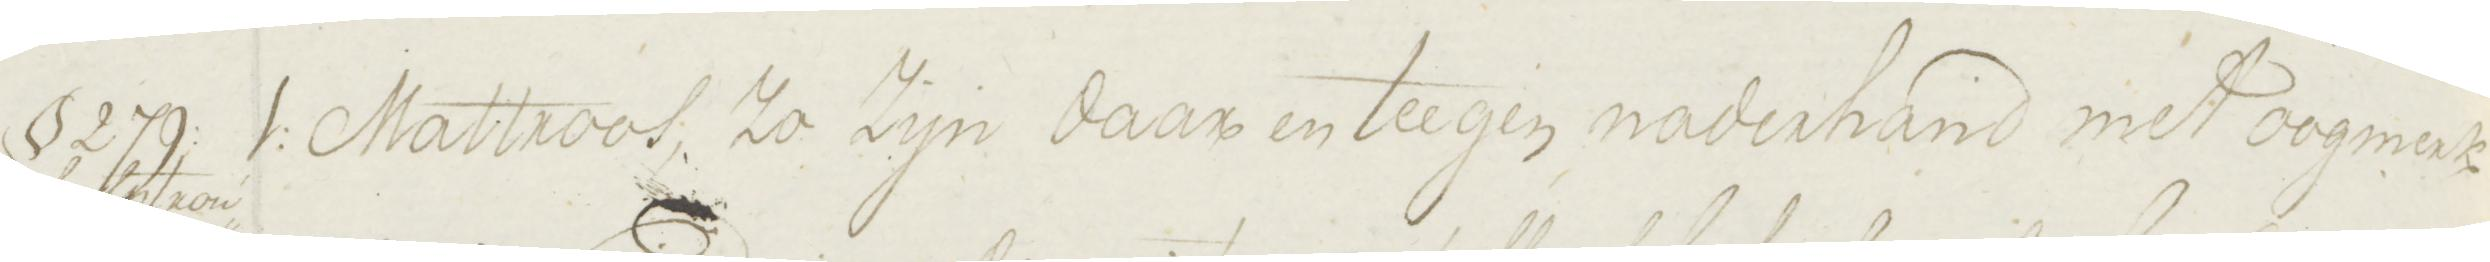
§ 279: 1: Mattroos zo zijn daar en teegen naderhand met oogmerk
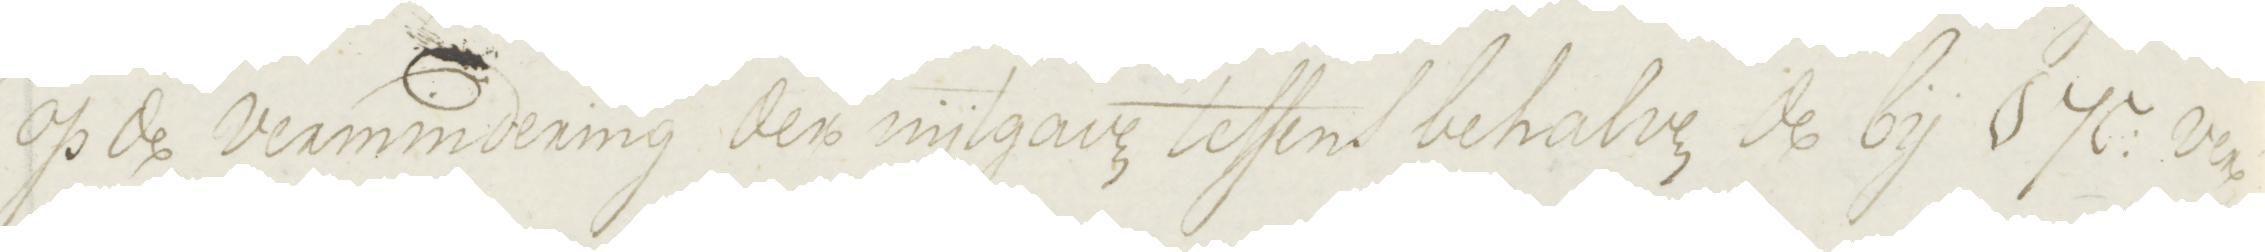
op de vermindering der uijtgaven teffens behalven de bij § 75: ver
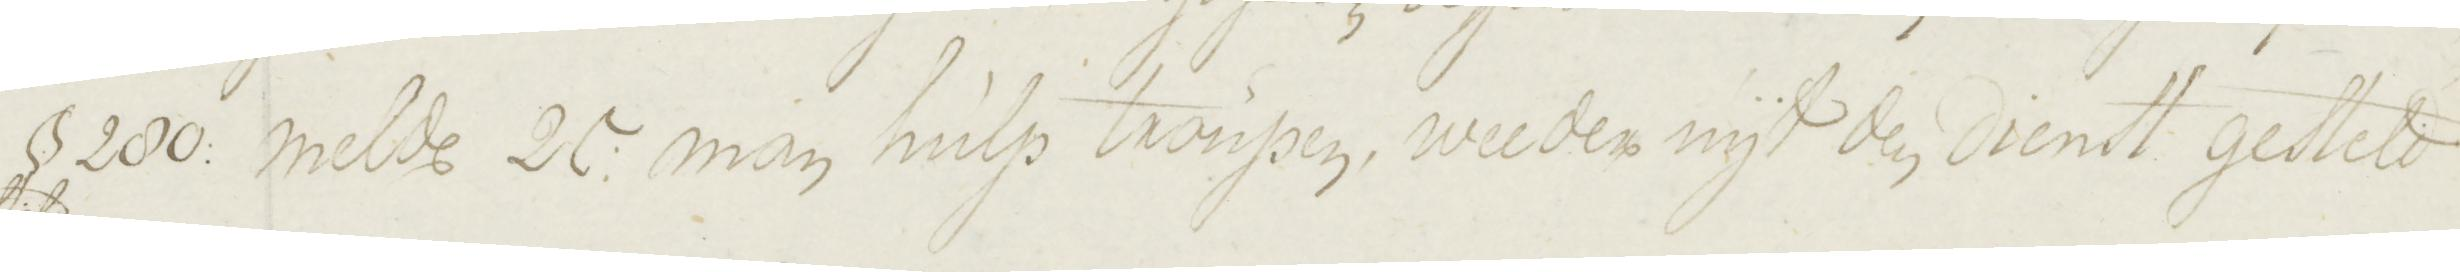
§ 280: melde 25: man hulp troupen, weeder uijt den dienst gesteld
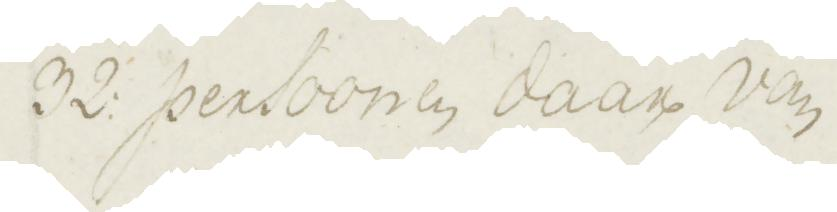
32: persoonen daar van
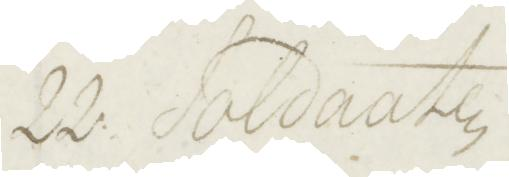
22: Soldaaten
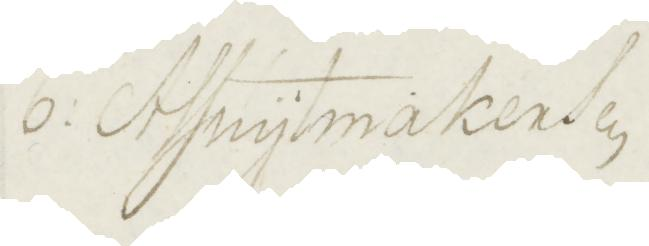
6: Affuijtmakersen
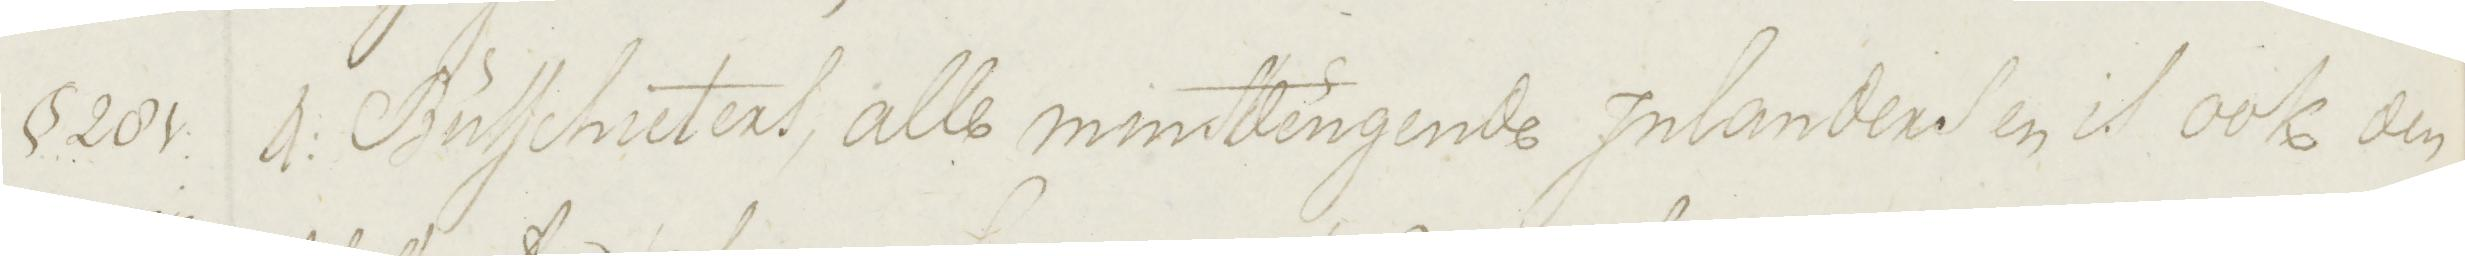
§ 281: 4: Busschieters, alle minstlengende Inlanders en is ook den
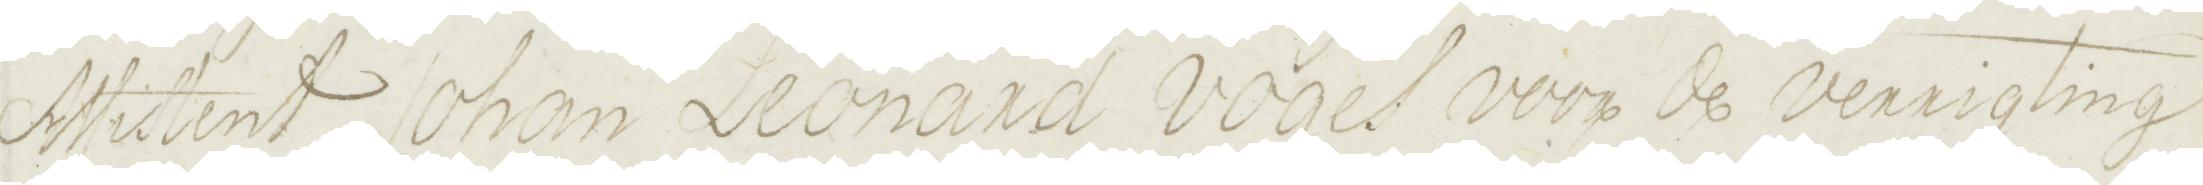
Assistent Johan Leonard Voges voor de verrigting
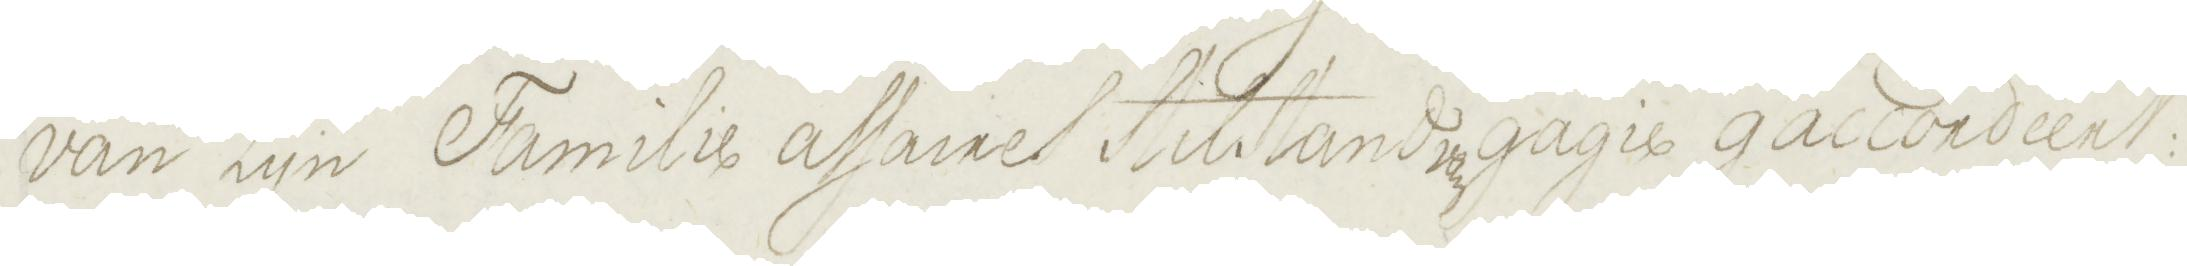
van zijn Familie affaires stilstand van gagie g’accordeert
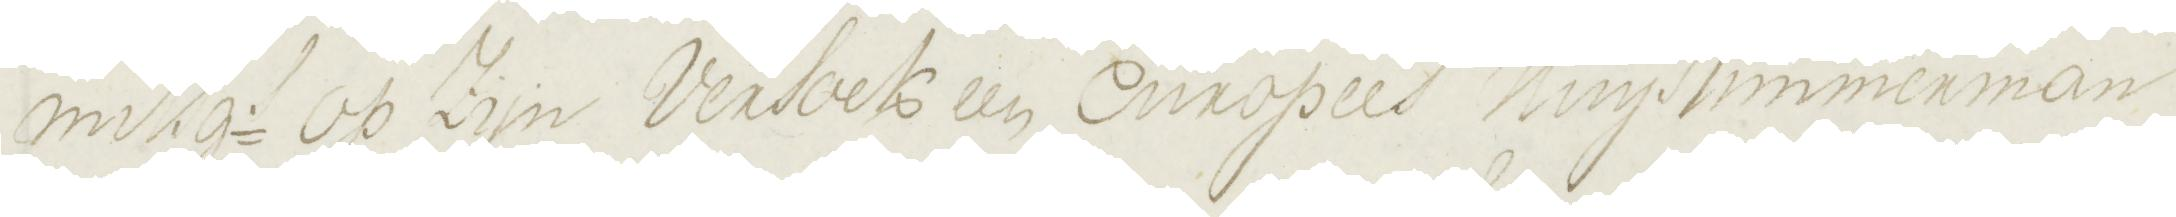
mitsg=s op zijn versoek een Europees Huijstimmerman
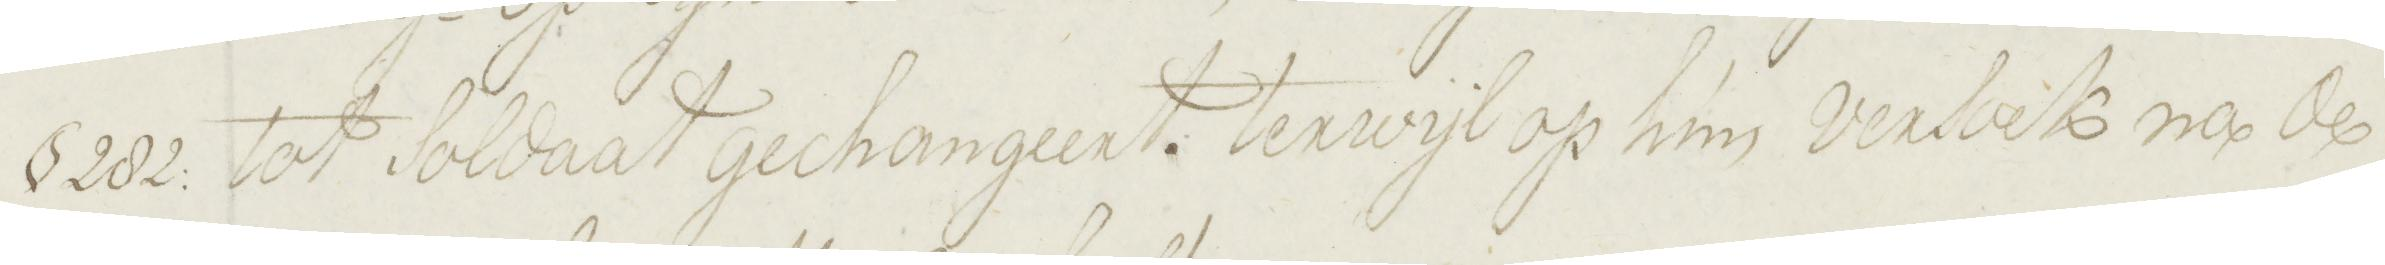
§ 282: tot soldaat gechangeert. terwijl op hun versoek na de
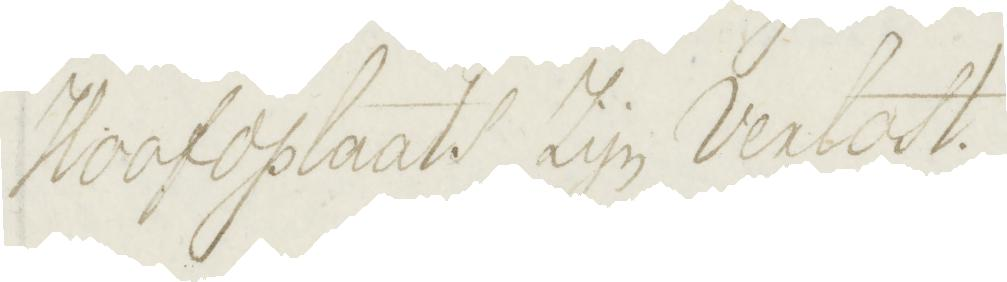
Hoofdplaats zijn verlost.
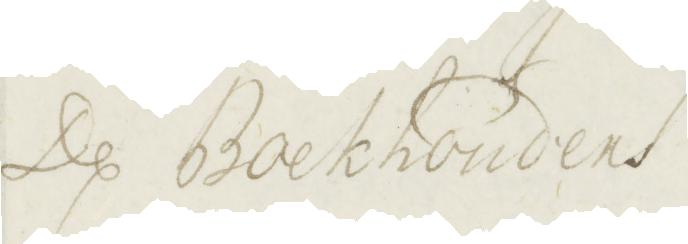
De Boekhouders
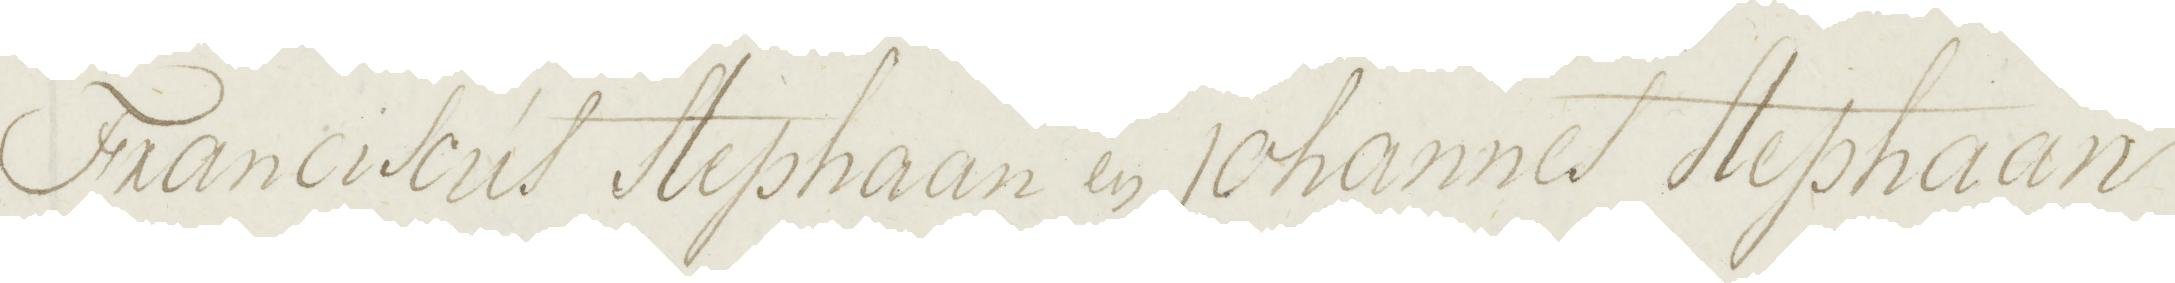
Franciscus Stephaan en Johannes Stephaan
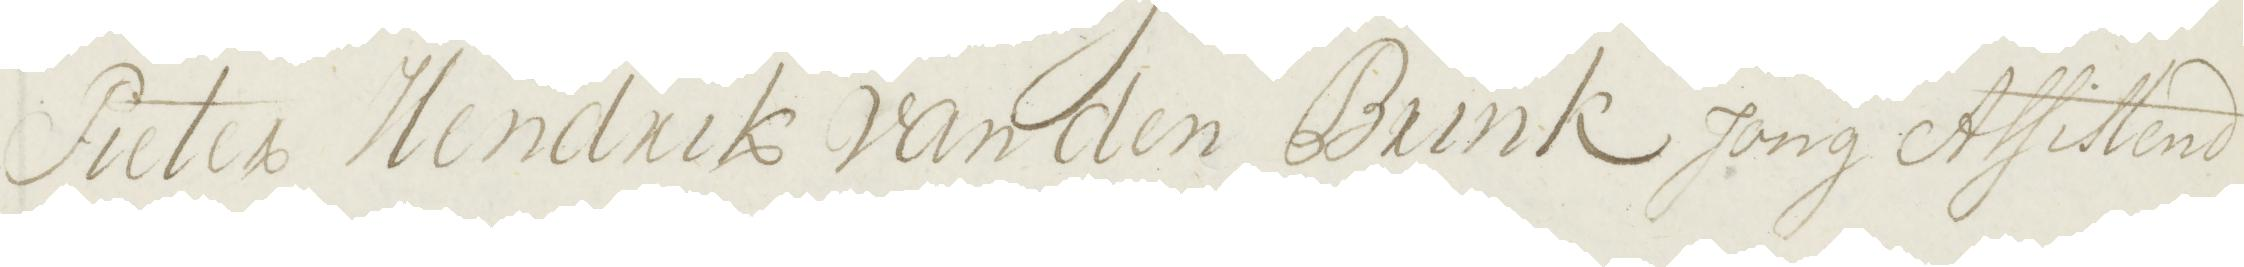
Pieter Hendrik van den Brink Jong Assistend
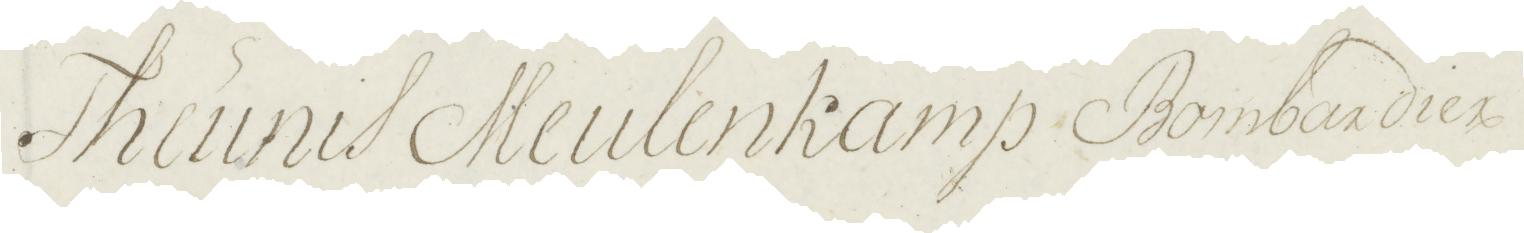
Theunis Meulenkamp Bombardier
